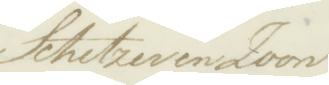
Schetzer en Zoon
